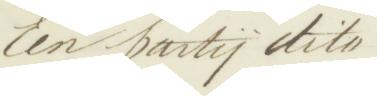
Een partij dito
